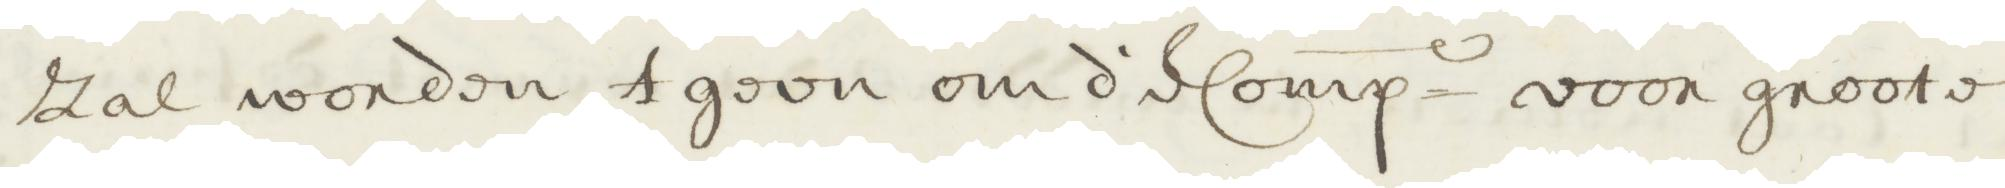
zal worden, t geen om d’ EComp=e voor groote
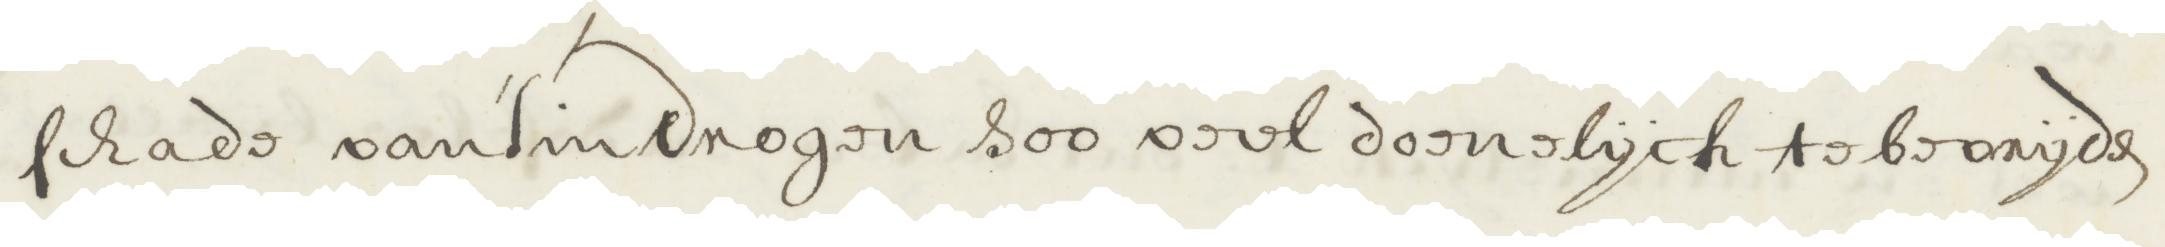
schade van't indrogen soo veel doenelijck te bevrijden
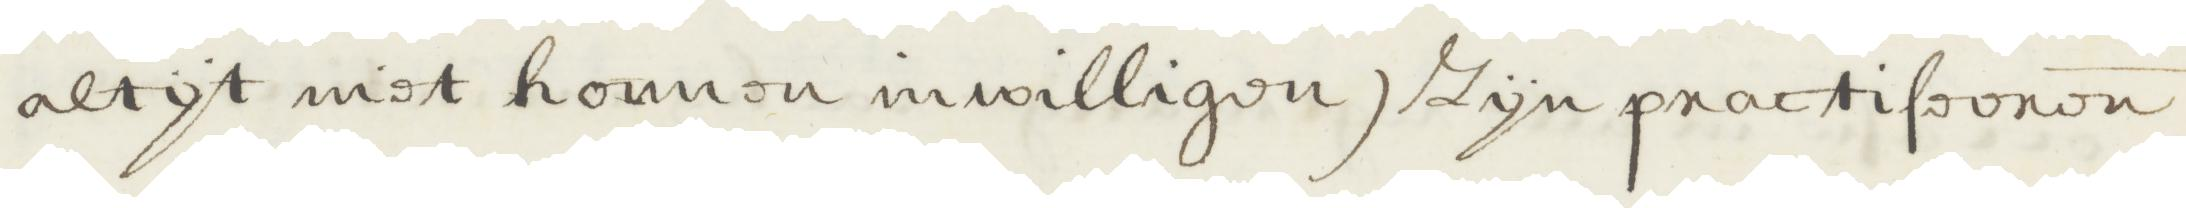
altijt niet konnen inwilligen) zijn practiseeren
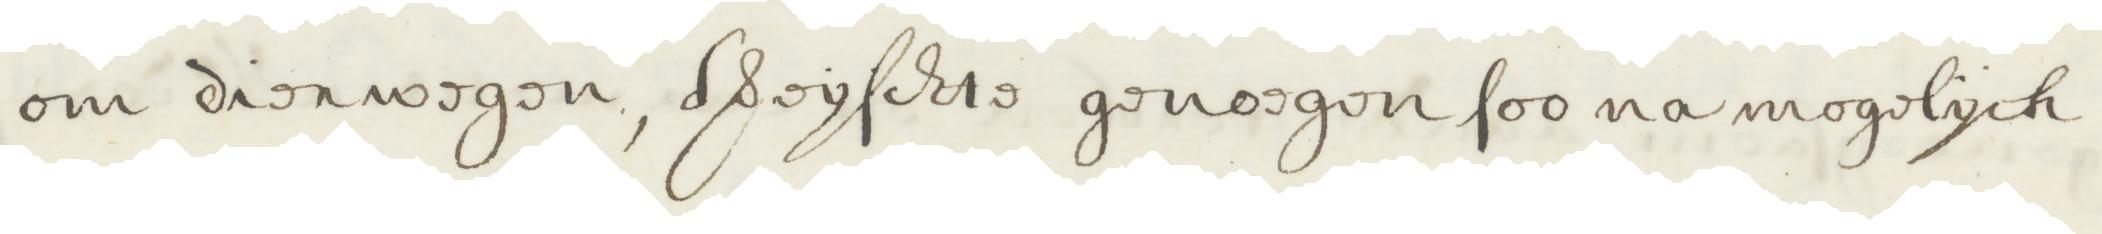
om dierwegen, t vereijschte genoegen soo na mogelijck
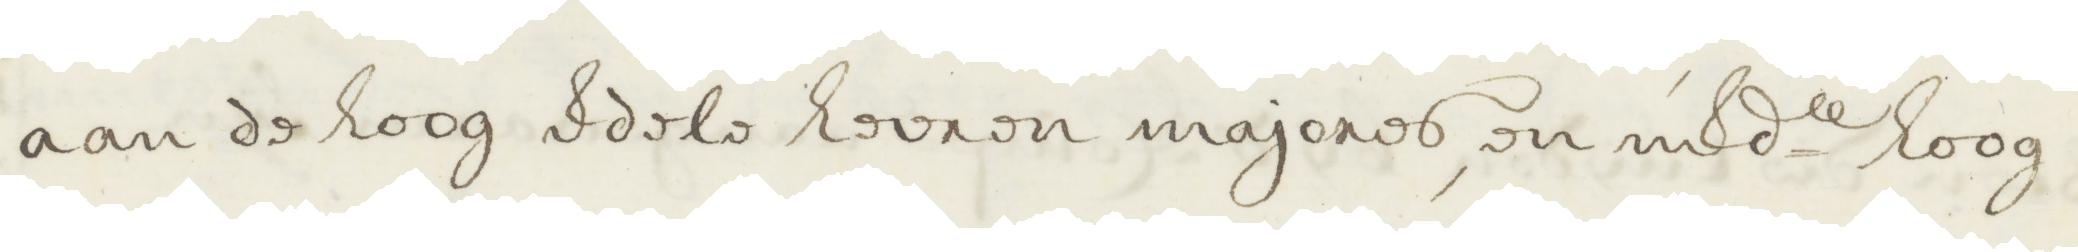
aan de hoog Edele heeren majores en uEd=le hoog
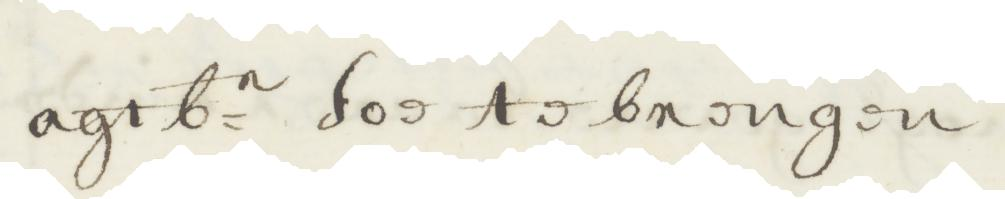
agtb=r toe te brengen
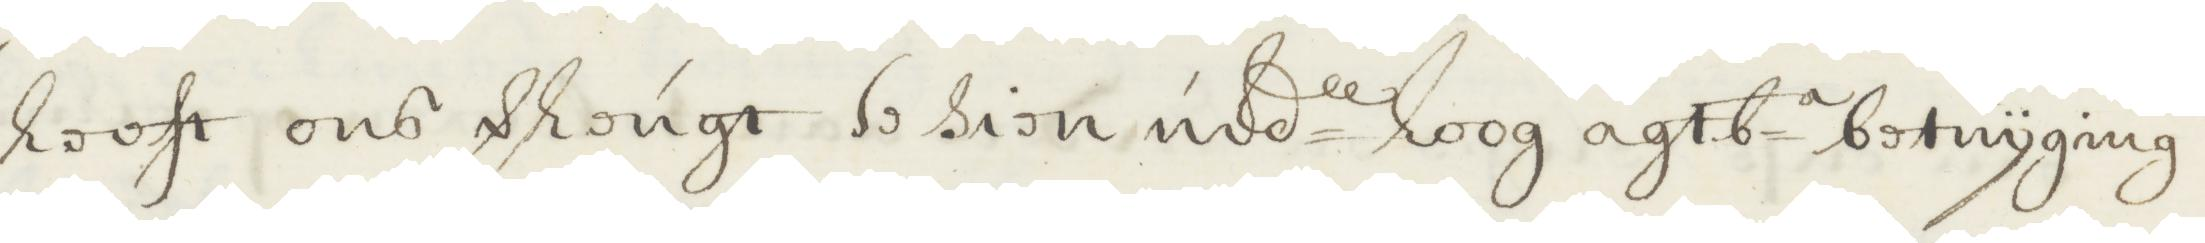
heeft ons verheugt te sien uEd=le hoog agtb=r betuijging
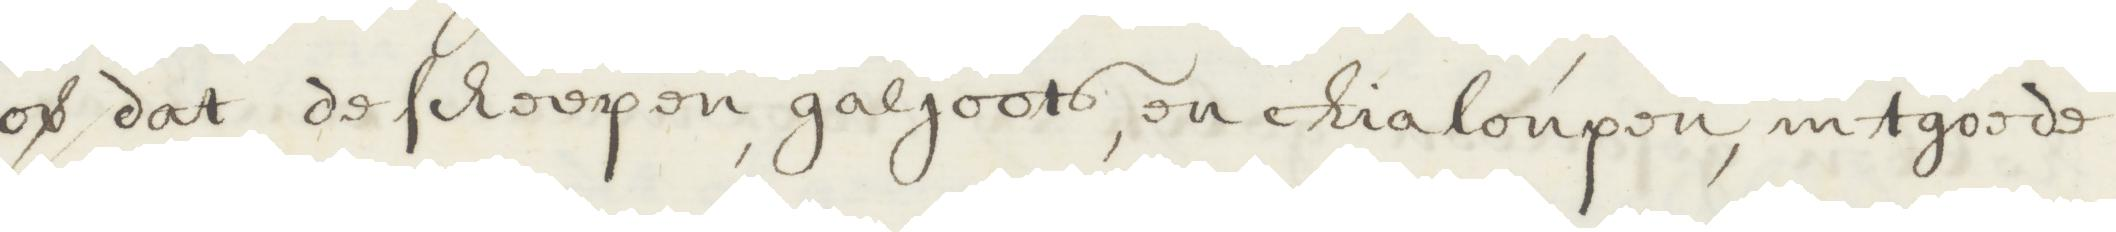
over dat de scheepen, galjoots, en chialoupen, in t goede
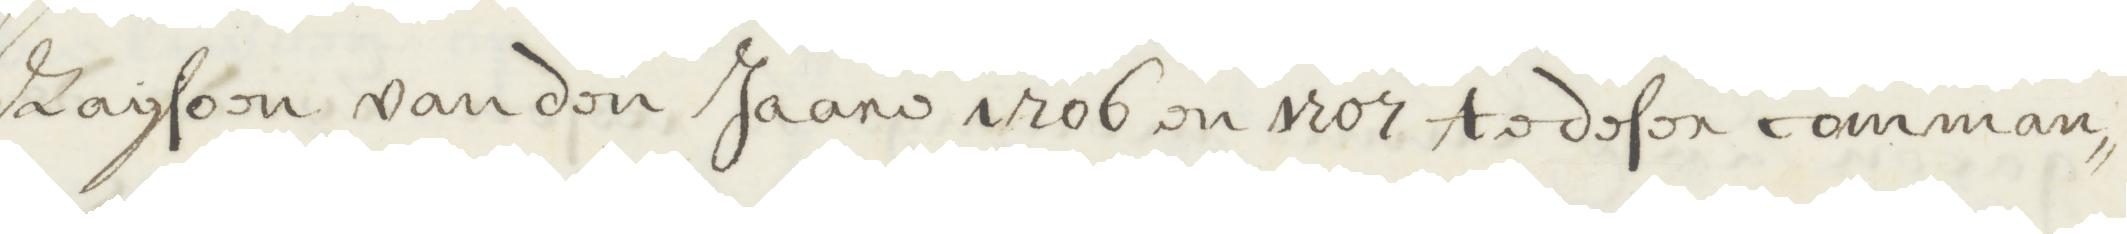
zaijsoen van den Jaare 1706 en 1707 te deser comman„
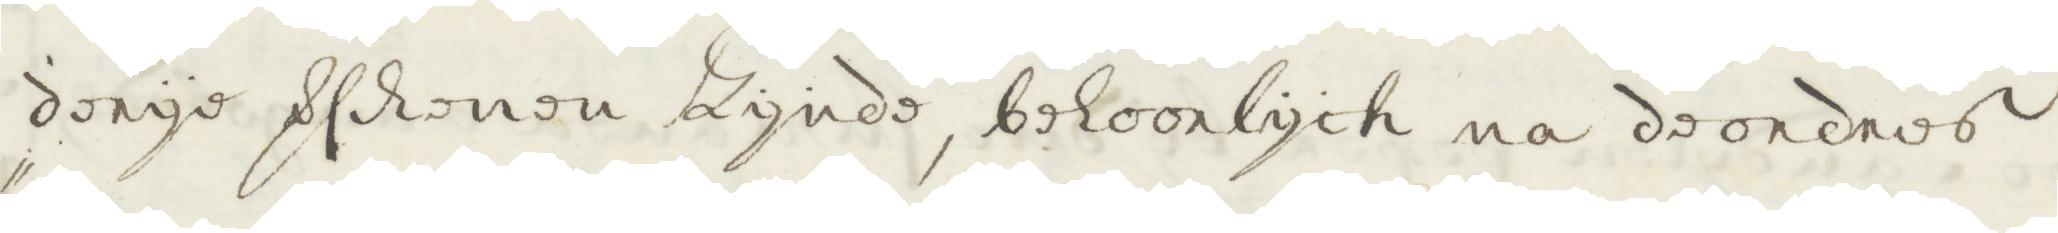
„derije verschenen zijnde, behoorlijck na de ordres
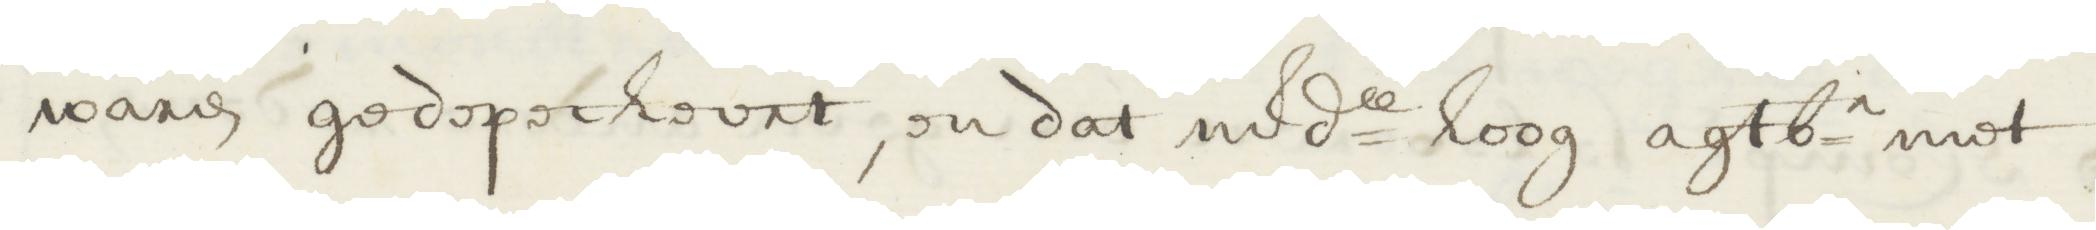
waren gedepecheert, en dat uEd=le hoog agtb=r met
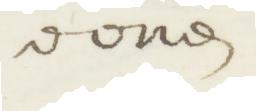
eenen
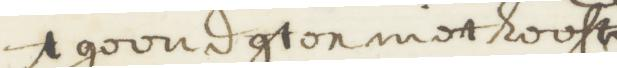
t geen Egter niet heeft
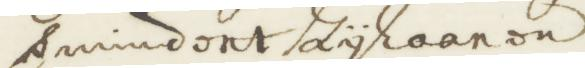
vermindert zij haaren
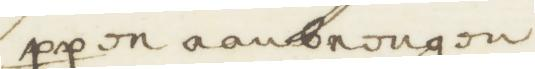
pper aanbrengen
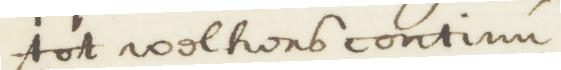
tot welkers continu
